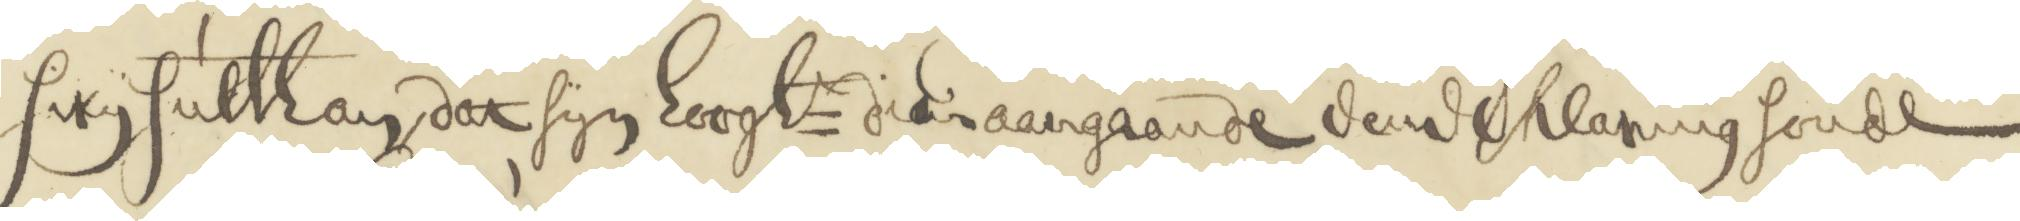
Sirij Sulthan, dat sijn hoogh=t dien aangaande eene Verklaring Soude
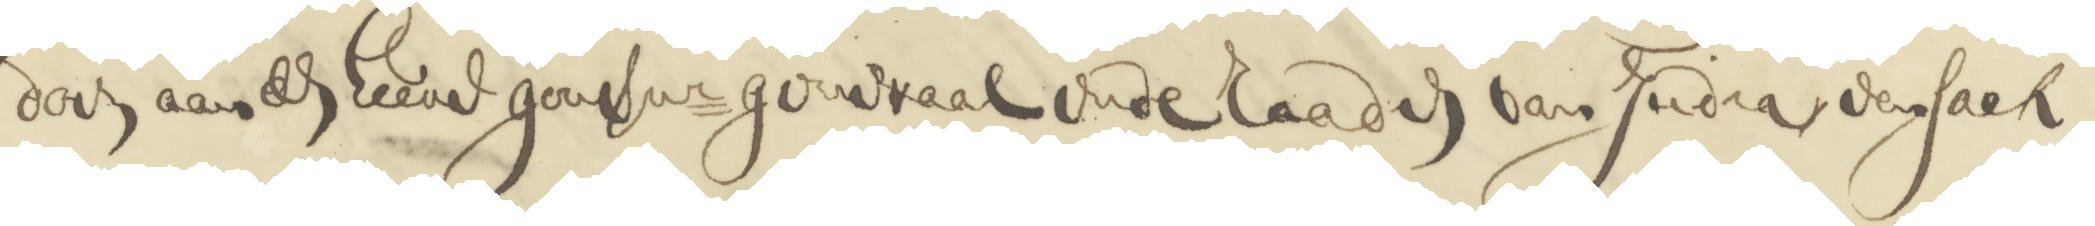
doen aan den heere gouvern=r generaal ende Raaden van Jndia, een Saek
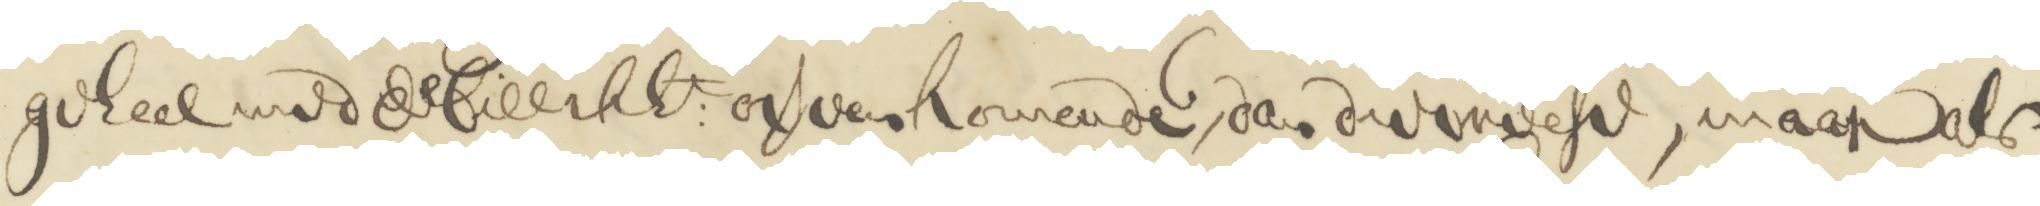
geheel med de billikh:t over van komende, dan die vreese, maar als
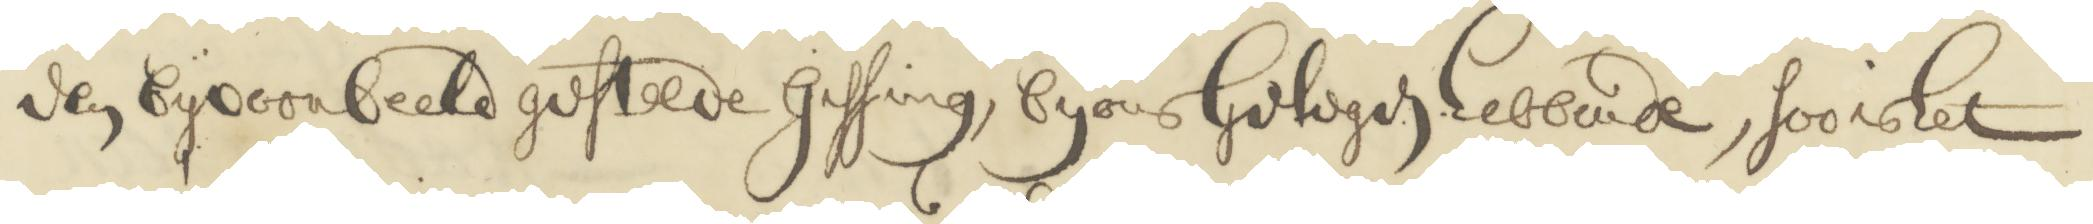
een bijvoorbeeld gestelde gissing, bij ons Gelegen hebbende, Soo is het
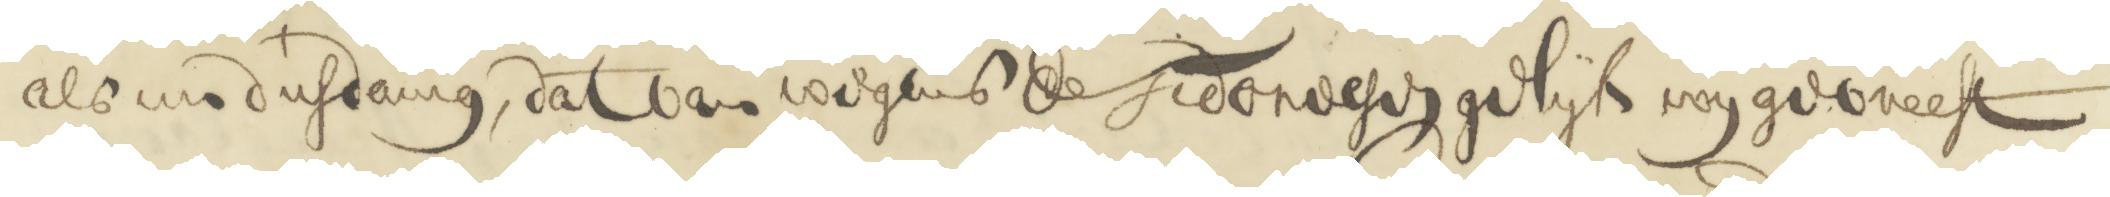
als nu dusdanig, dat van wegens de Tidoresen gelijk wij gevreest
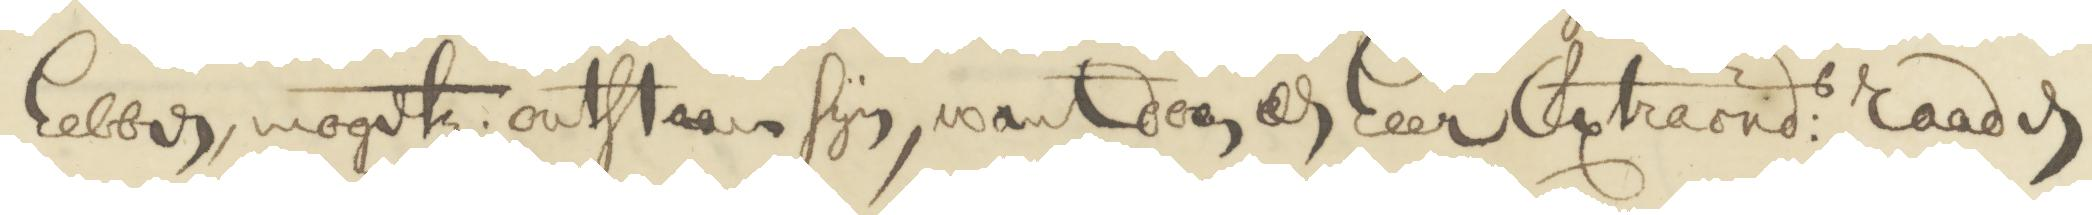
hebben, mogelijk ontstaan sijn, want doen den heer Extraord:s Raad en
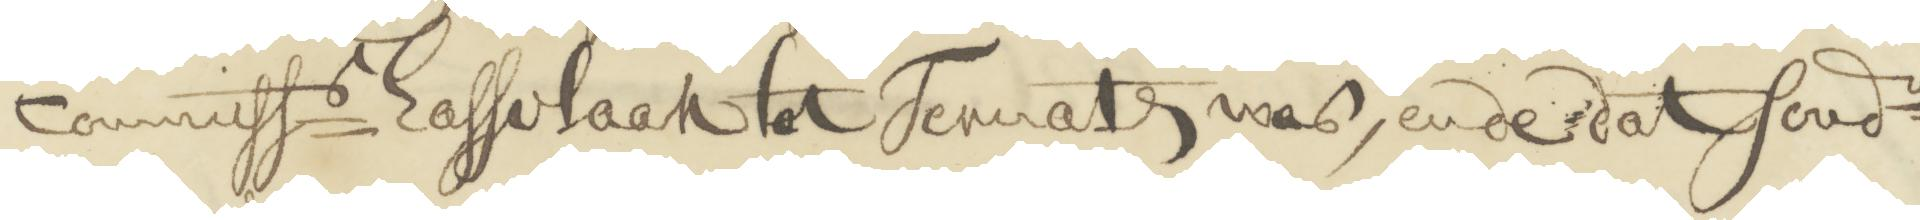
Commiss=s hasselaar tot Ternaten was, ende dat Sond=er
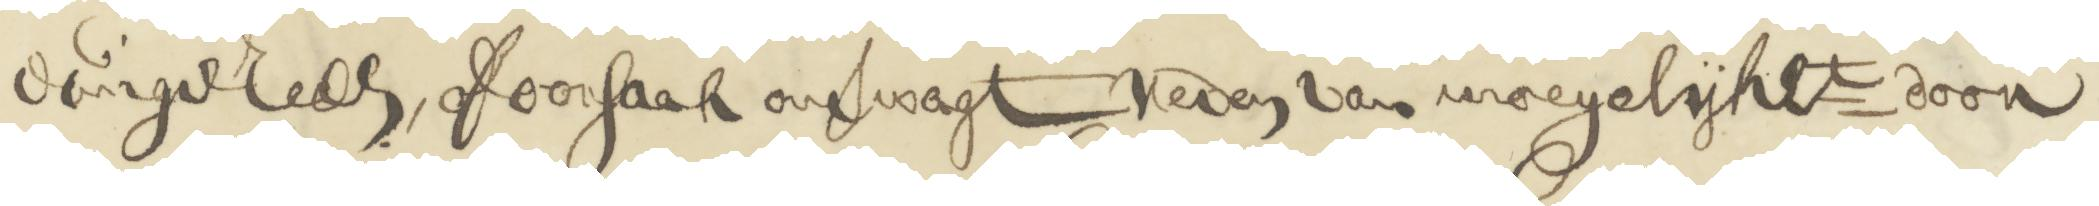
eenige Reden, of oorsaak onverwagt reden van moeijelijkh=t door
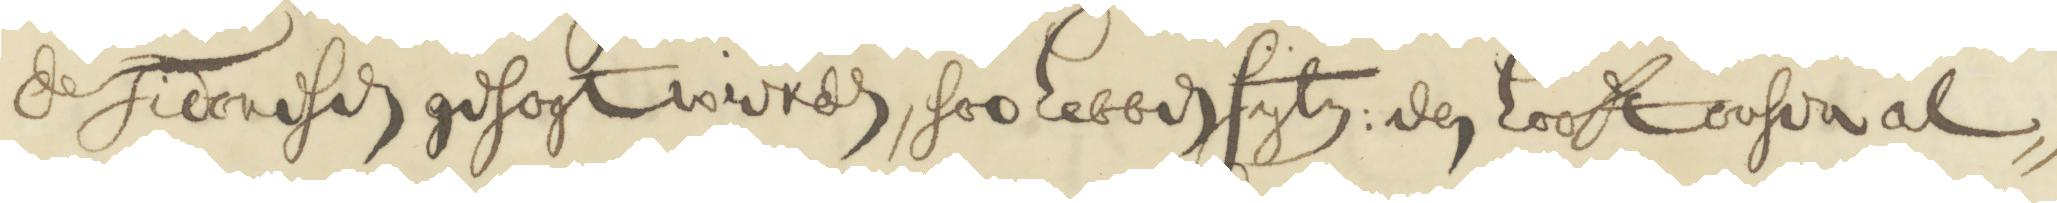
de Tidoresen gesogt werden, soo hebben Sijl:en een hooft ooser al„
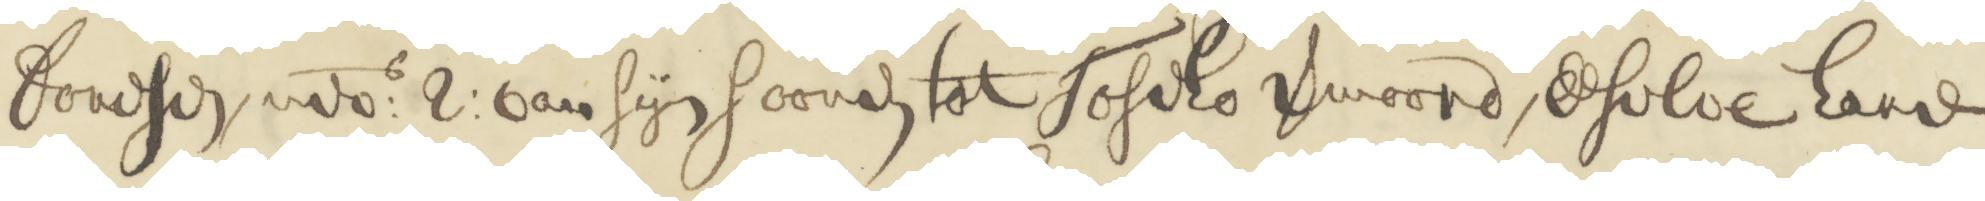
foresen, nev:s 2: van sijn soonen tot Toseho vermoord, deselve hare
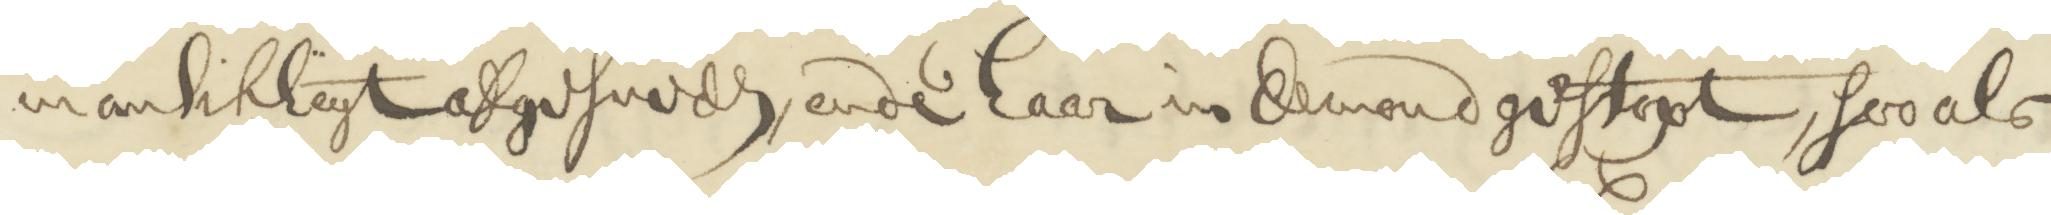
manlikheijt afgesneeden, ende haar in demond gestopt, soo als
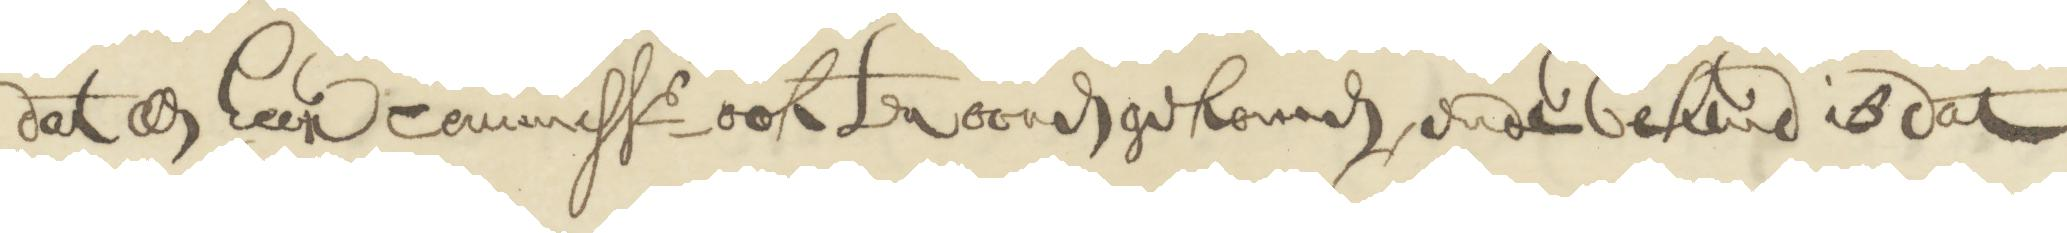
dat den heer commiss=s ook ter ooren gekomen, ende bekend is dat
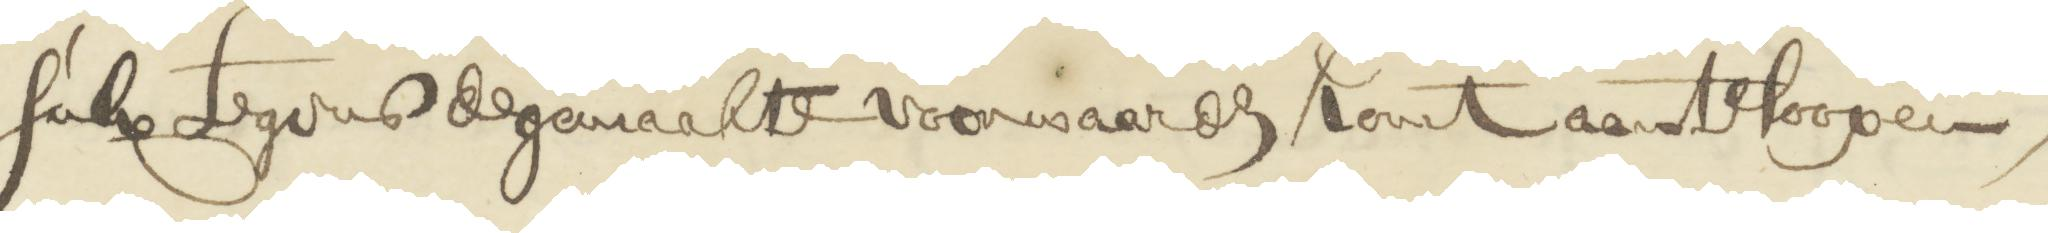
sulx tegens de gemaakte voorwaarden komt aan te loopen,
